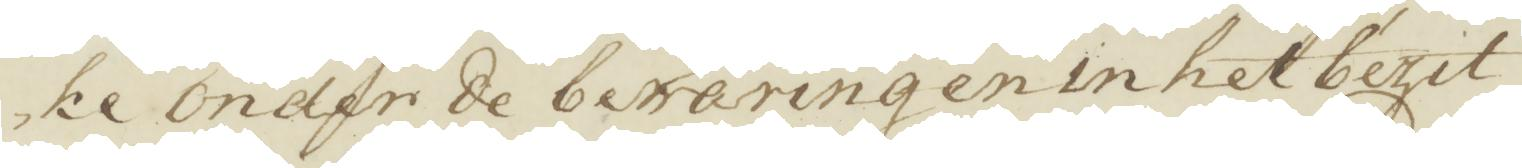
„ke onder de bewaring en in het bezit
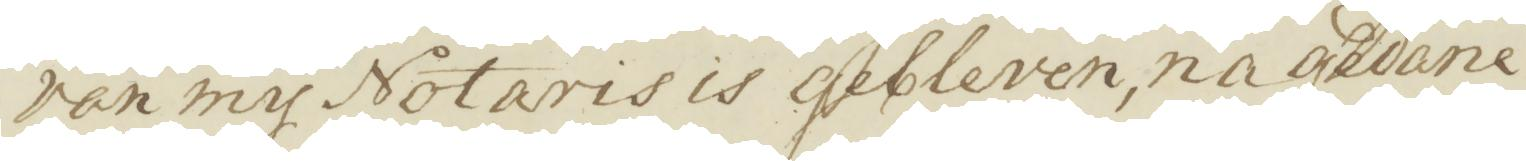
van my Notaris is gebleven, na gedane
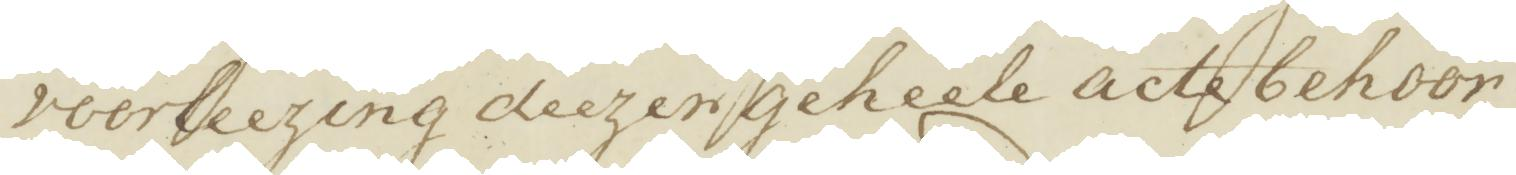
voorleezing deezen geheele acte behoor
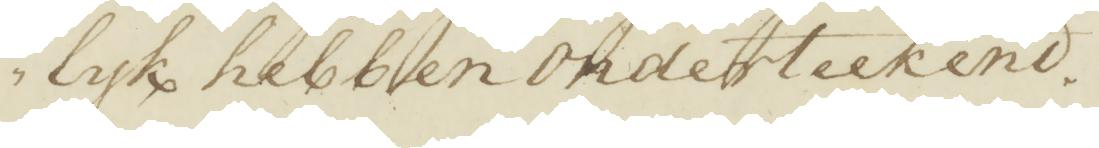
„lyk hebben onderteekend.
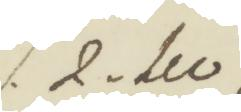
ƒ 2„40
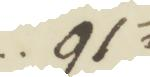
„ —. 91 ½
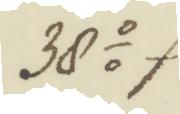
38 %
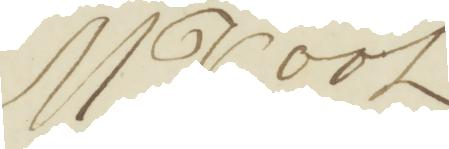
M Kool
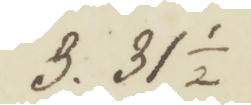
ƒ 3. 31 ½
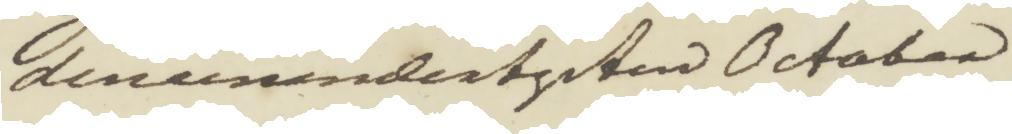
deneenendertigsten October
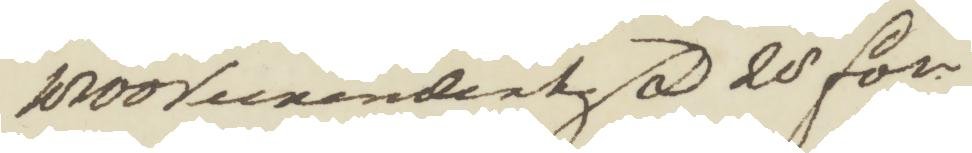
1800Vierendertig D 28 fol.
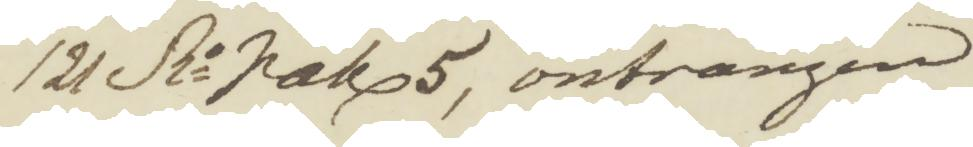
121 R=o Vak 5, ontvangen
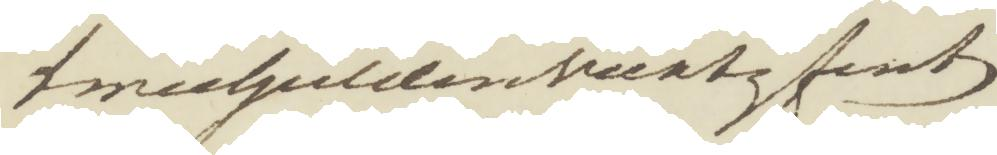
tweeGulden veertig Cent
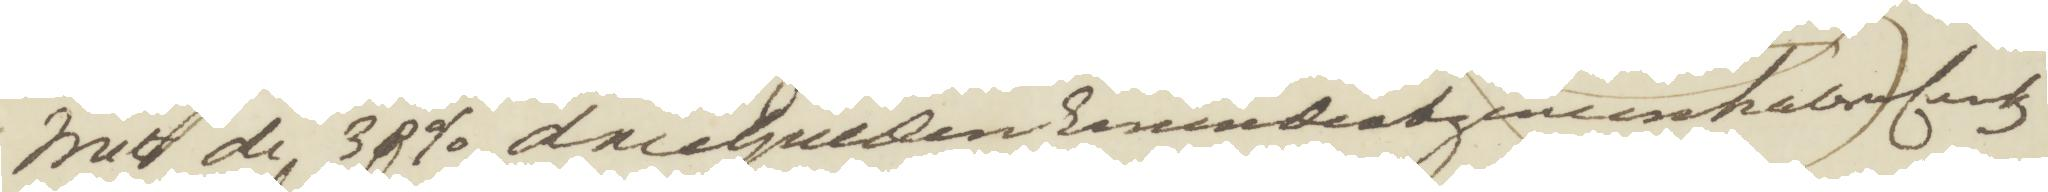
met de 38% drieGulden EenenzestigeneenhalveCent
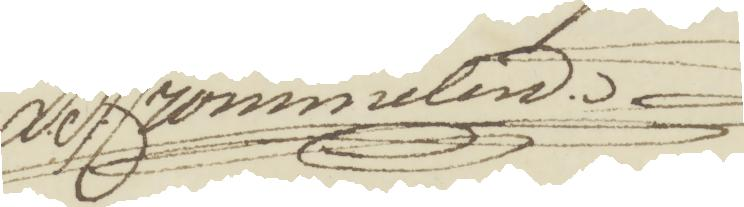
D:.F: Crommelin
